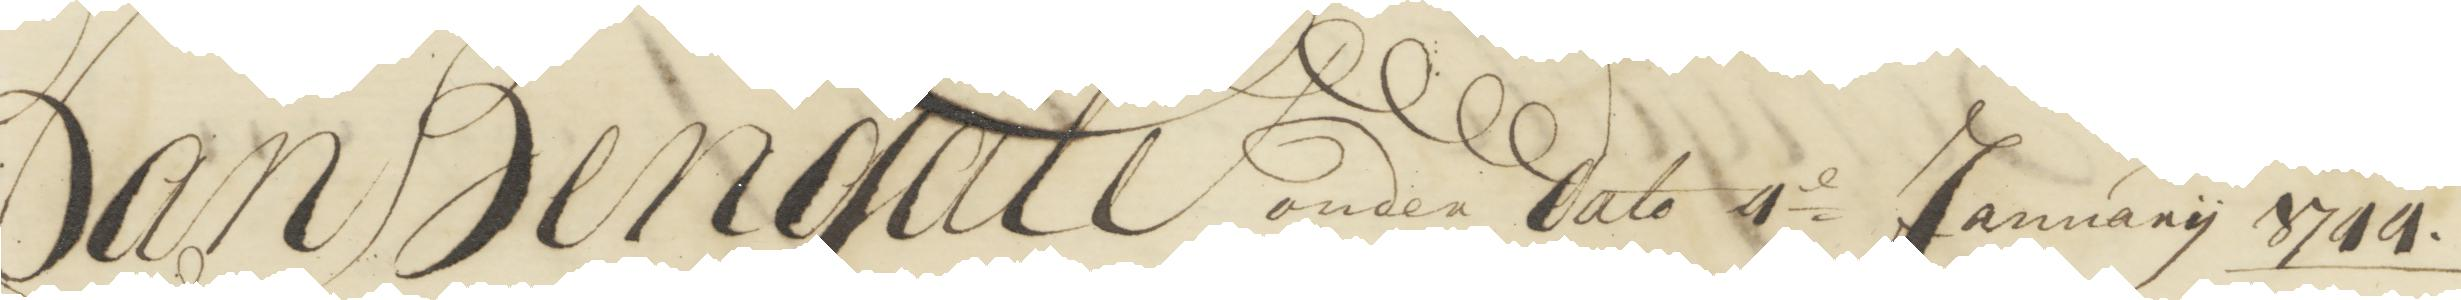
Van Bengale onder dato 4=e Januarij 1744.
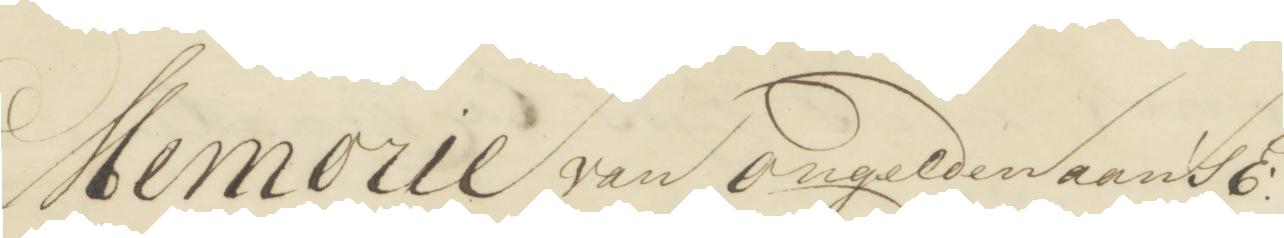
Memorie van ongelden aan 's E:
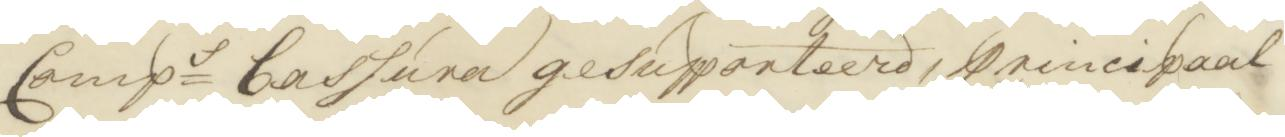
Comp=s bassura gesupporteerd, principaal
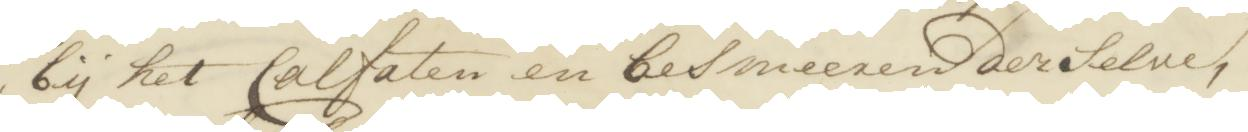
bij het Calfaten en besmeeren derselve,
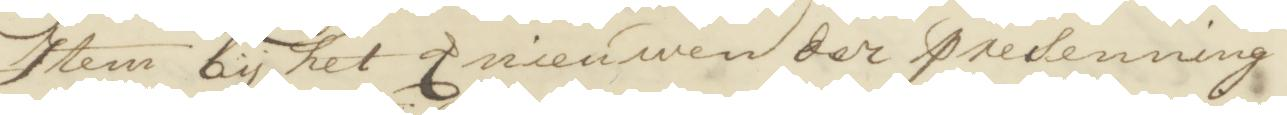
Jtem bij het vernieuwen der presenning
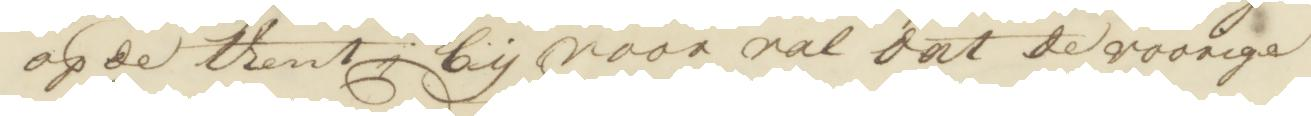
op de thent, bij voorval dat de voorige
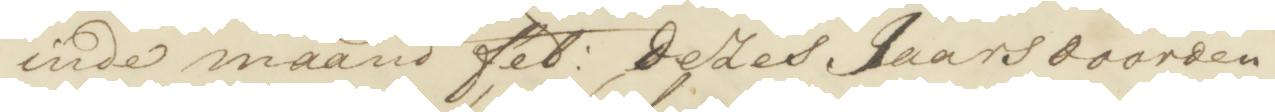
in de maand feb: dezes Iaars door den
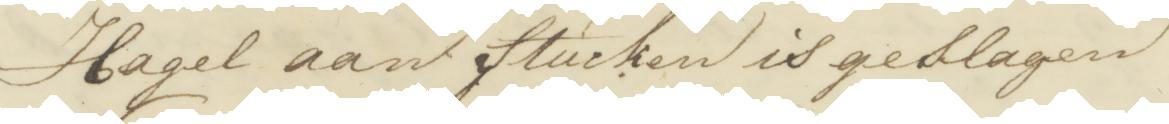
Hagel aan stucken is geslagen
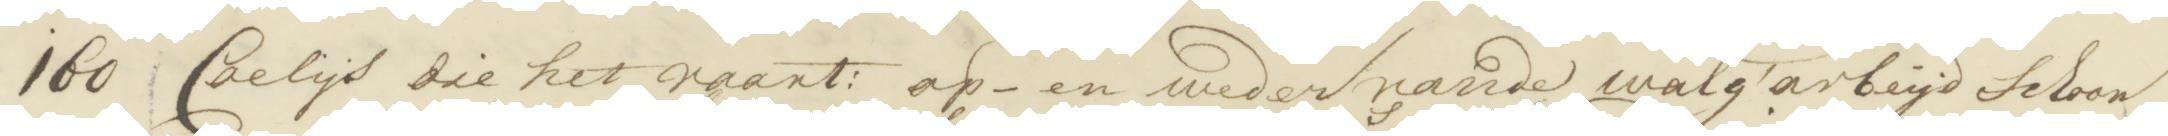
160 Coelijs die het vaart: op_en weder van de wal g'arbeijd Schoon
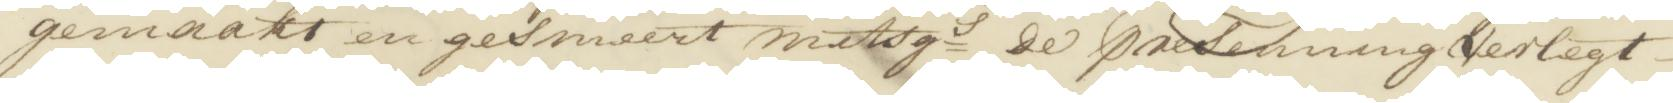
gemaakt en gesmeert mitsg=s de presenning verlegt
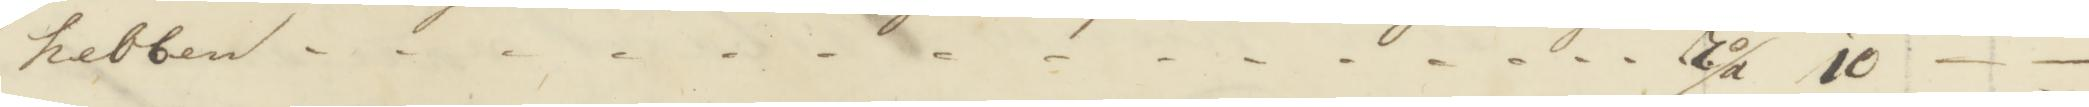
hebben - - - - - - - - - - - - - - - - - - ro/a 10 — —
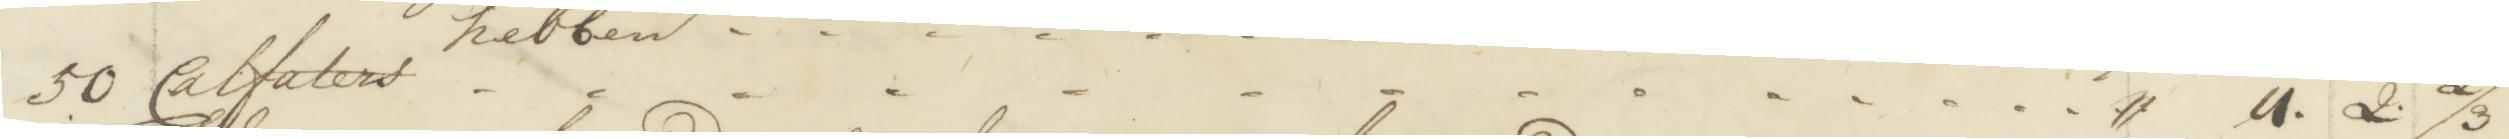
50 Calfaters - - - - - - - - - - - - - - - - „ 4. 2. 2/3
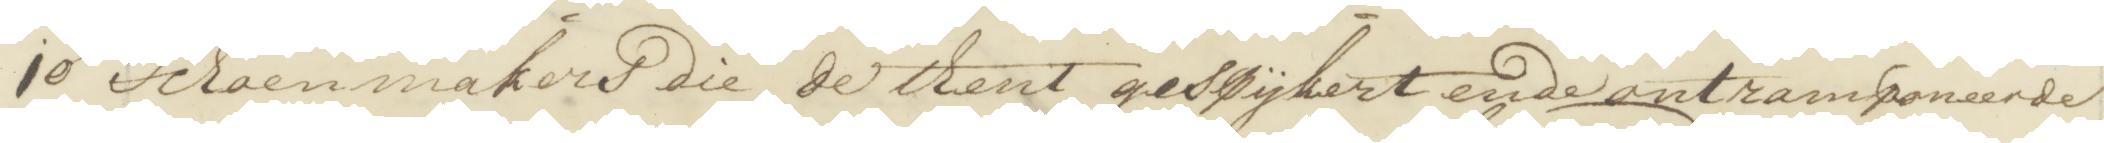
10 schoenmakers die de thent gespijkert en de ontramponeerde
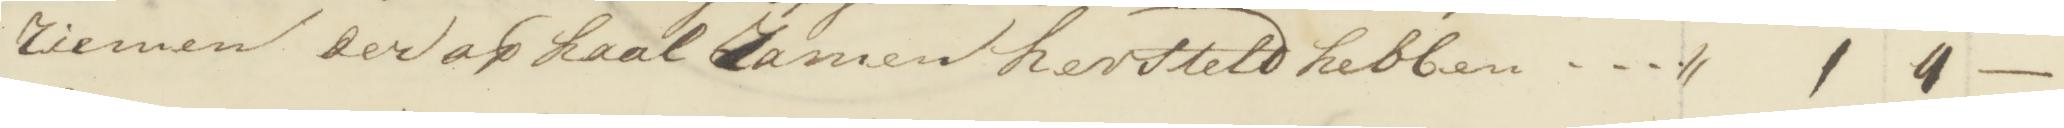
riemen der ophaal ramen hersteld hebben - - - „ 1 4 —
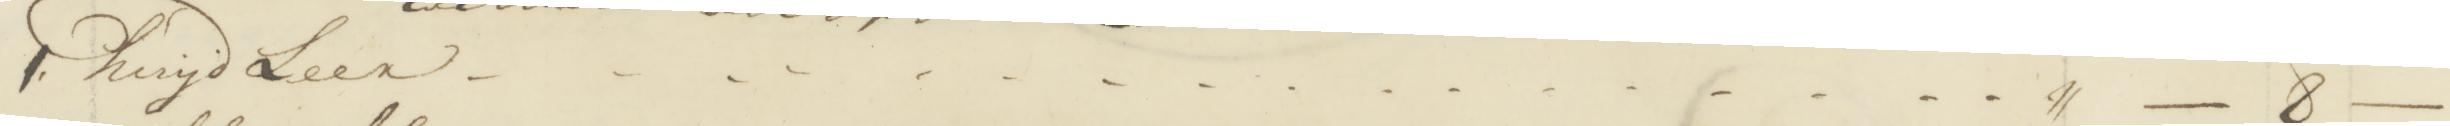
1. huijd leer „ - - - - - - - - - - - - - - - - - - - - „ — 8 —
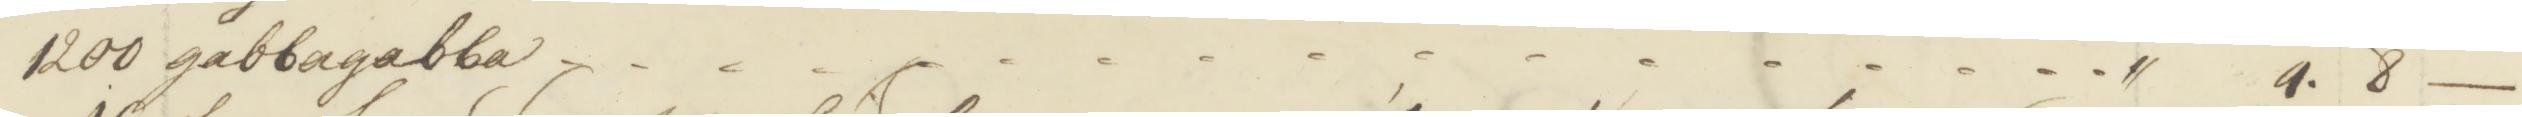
1200 gabbagabba - - - - - - - - - - - - - - - - - „ 4. 8 —
